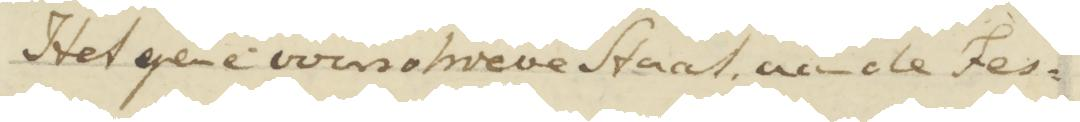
Hetgene voorschreve staat, aan de Tes=
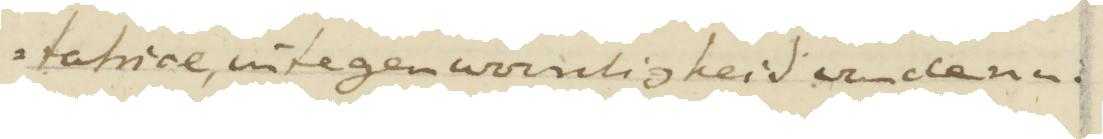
„tatrice, in tegenwoordigheid van de na
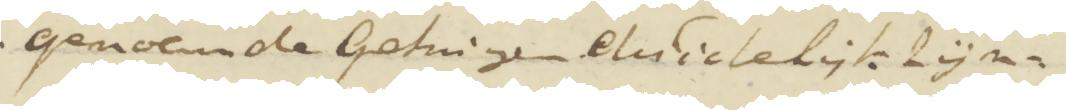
-genoemde Getuigen duidelijk zijn=
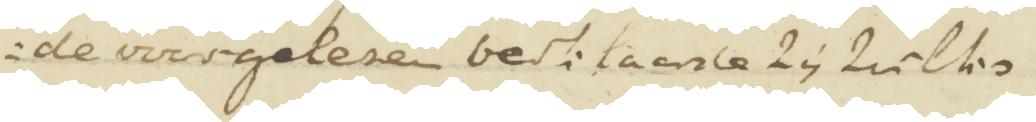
=de voorgelezen verklaarde zij zulks
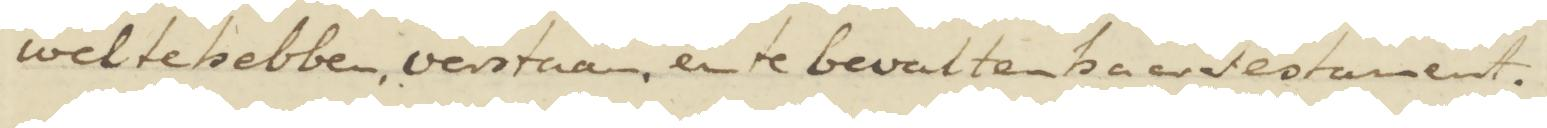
wel te hebben, verstaan, en te bevatten haar Testament.
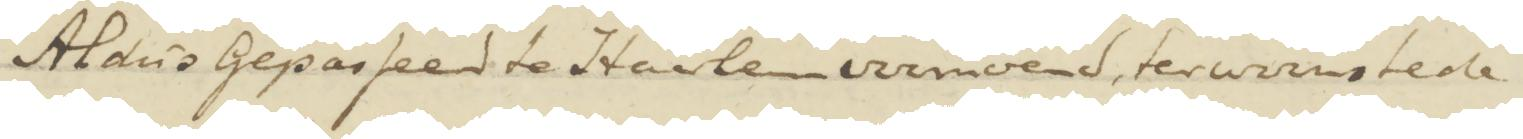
Aldus Gepasseerd te Haarlem voornoemd, ter woonstede
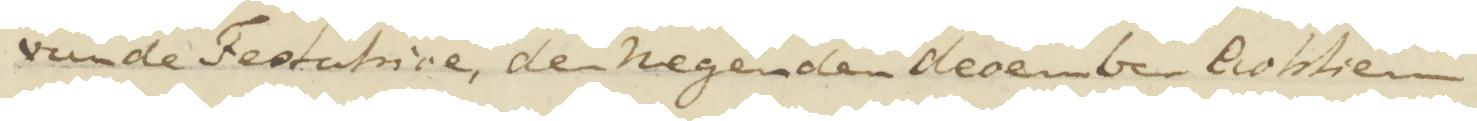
van de Testatrice, den negenden december Achtien
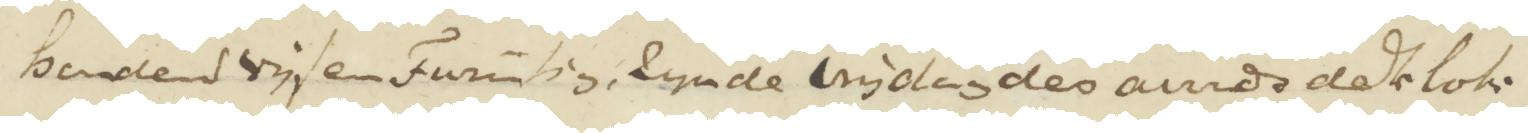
honderd vijf en Twintig, Zynde vrijdag des avonds de klok
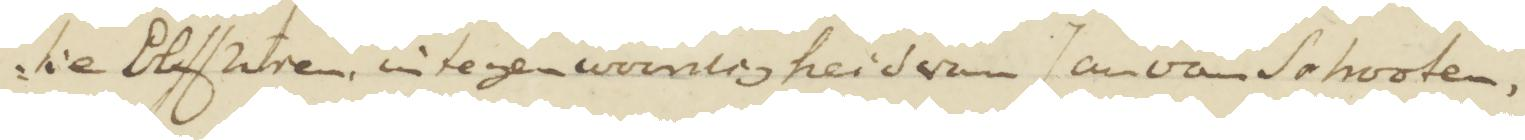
„ke Elf uren, in tegenwoordigheid van Jan van Schooten,
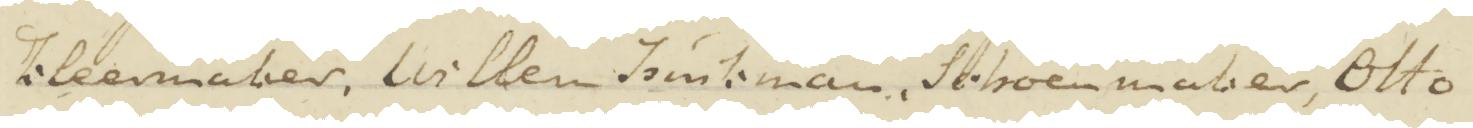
kleermaker, Willem Huikman, schoenmaker, Otto
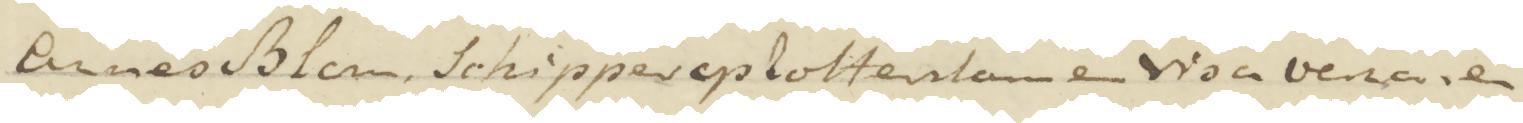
Annes Blom, schipper op Rotterdam en Waaveren en
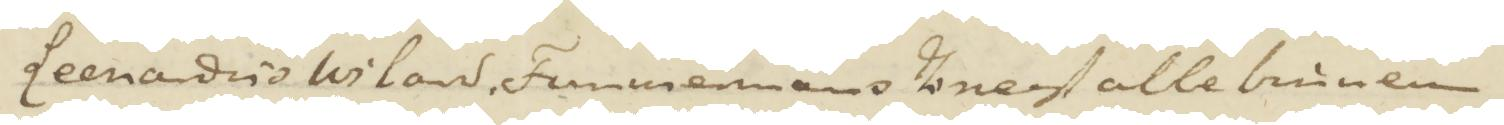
Leonardus Wilard, Timmermans knegt alle binnen
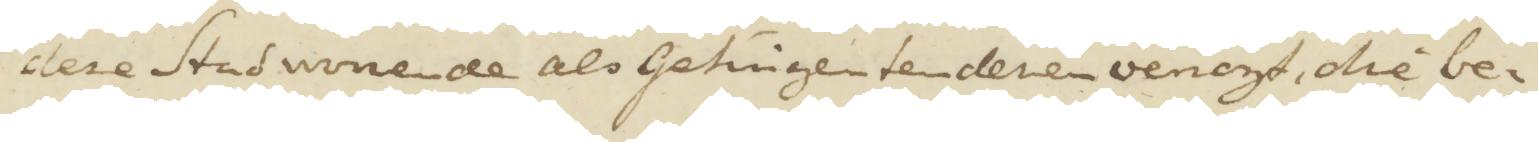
deze stad wonende als Getuigen ten dezen verzogt, die be=
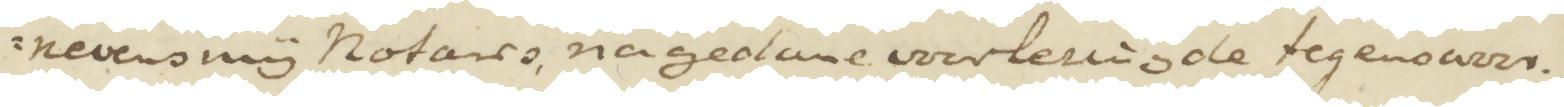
=nevens mij Notaris, na gedane voorlezing de tegenswoor.
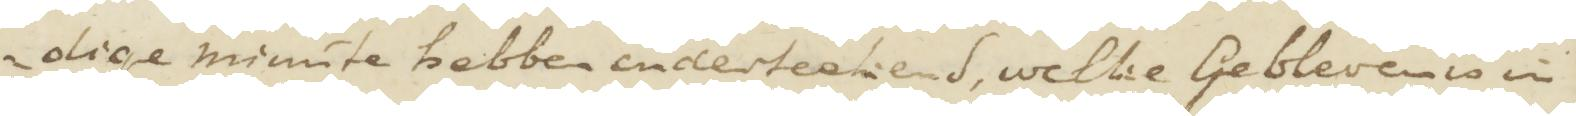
=dige minute hebben onderteekend, welke Gebleven is in
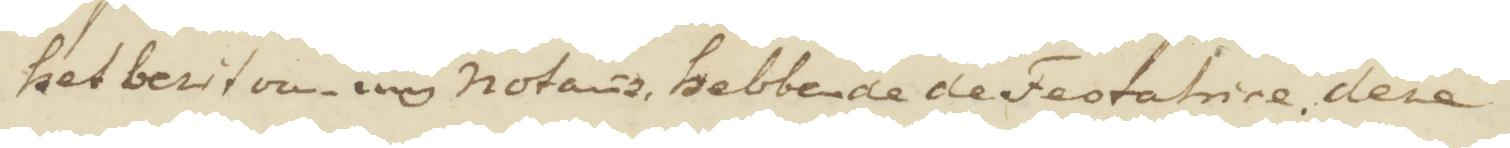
het bezit van mij Notaris, hebbende de Testatice, deze
